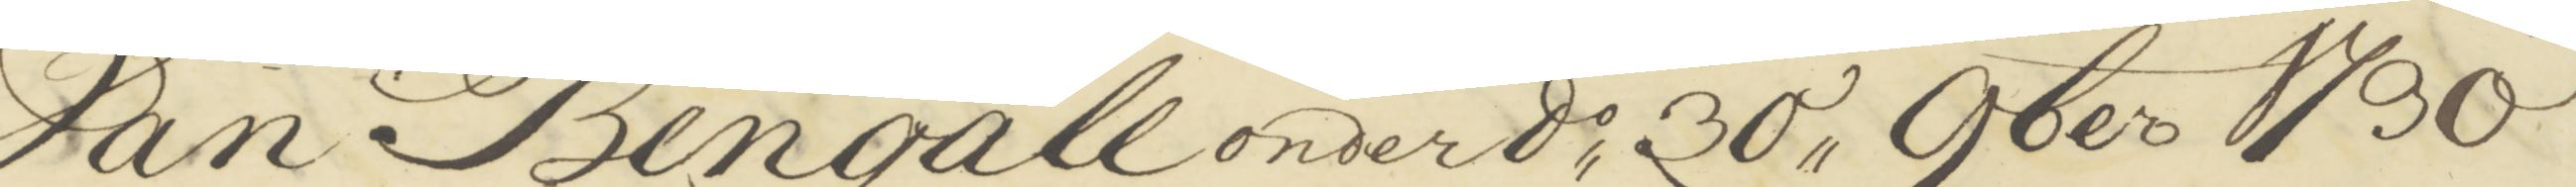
Van Bengale onder d„o 30„' 8ber 1730
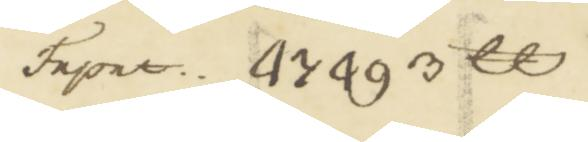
Trprt.. 47493 lb
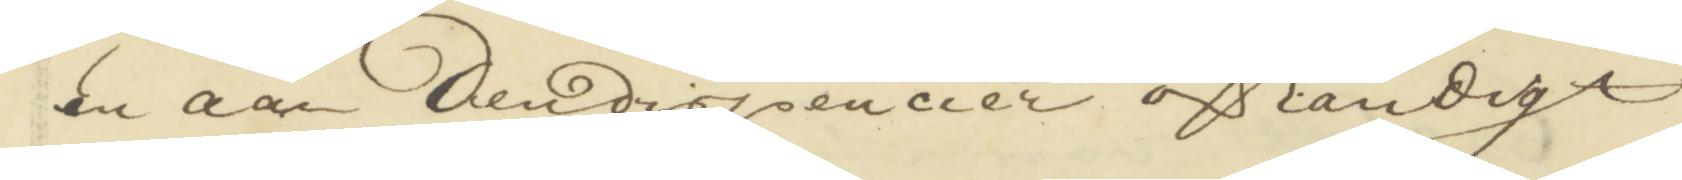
En aan den dispencier overhandigt
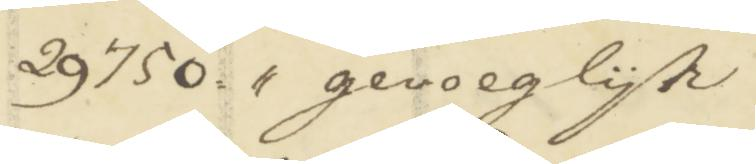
29750: „ gevoeglijk
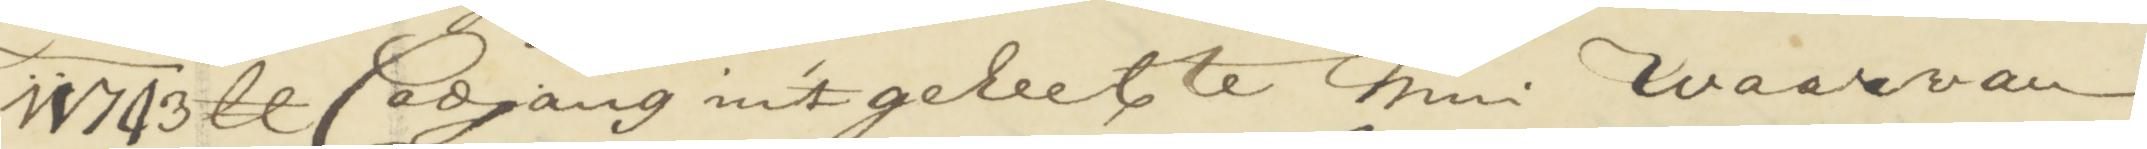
11743 lb Cadjang in’t geheel te min waarvan
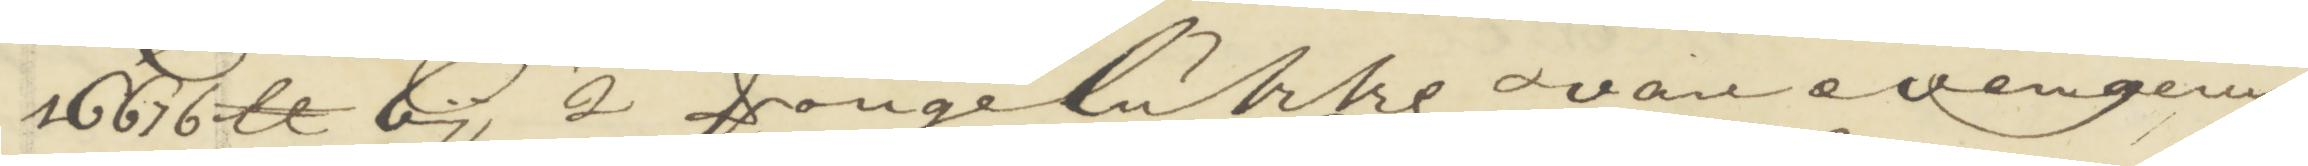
16616 lb bij 't verongelukken van even gem:
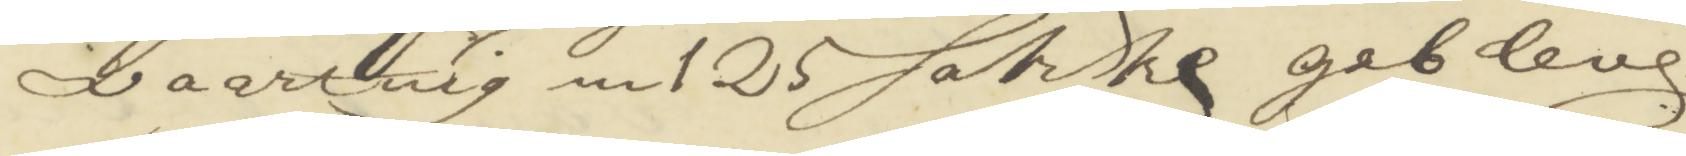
vaartuig in 125 Sakke gebleven
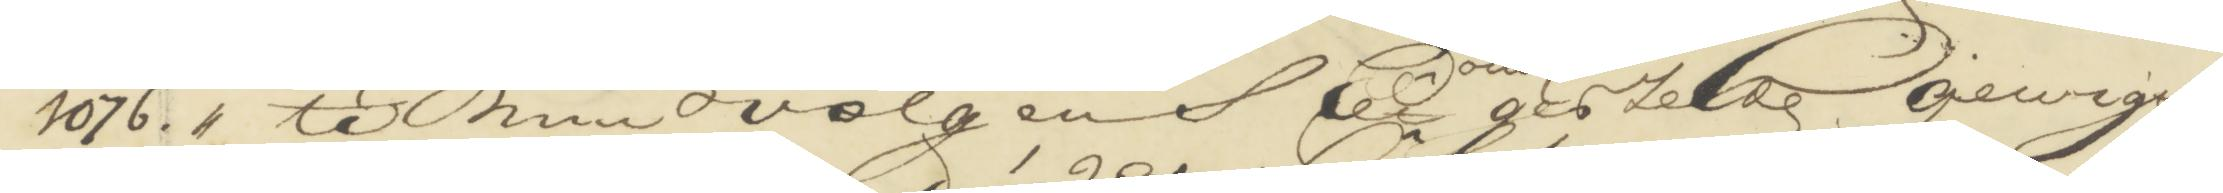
1076. „ te min volgens ter gestelden gewigt
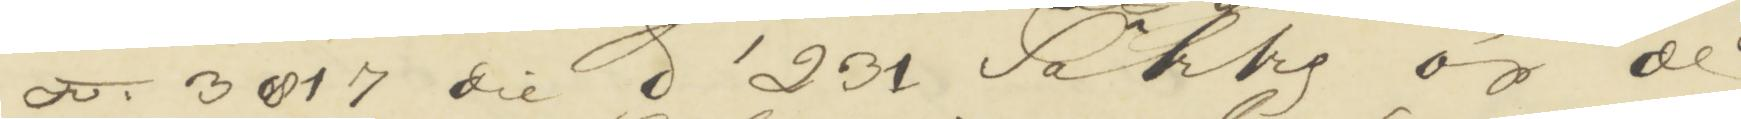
te 3817 die d' 231 sakken op de
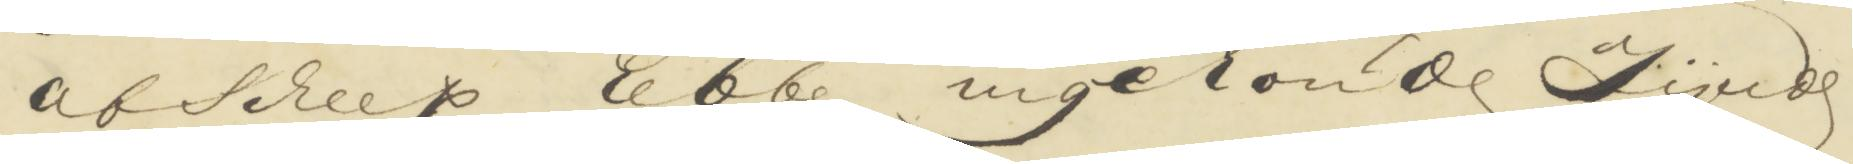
afscheep hebben ingehouden Zijnde
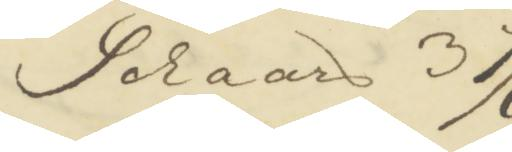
Schaars 37/16 P C:o
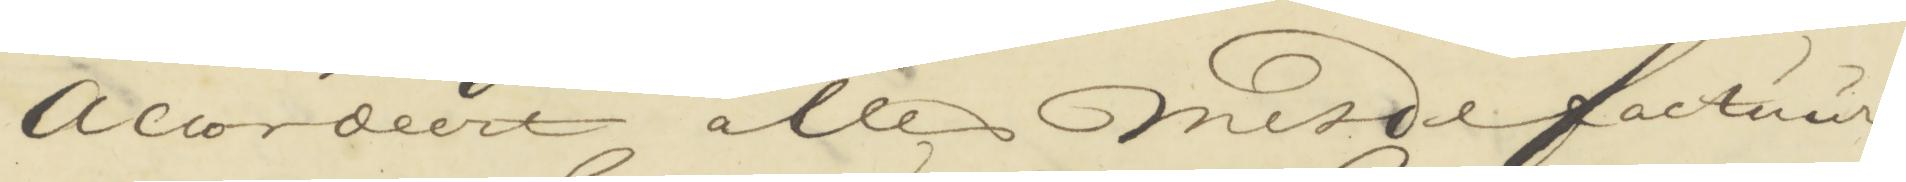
't overige Accordeert alle met de factuur
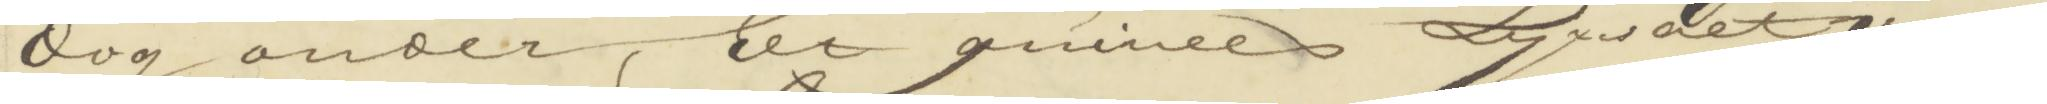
dog onder het guinees Lywaet voor
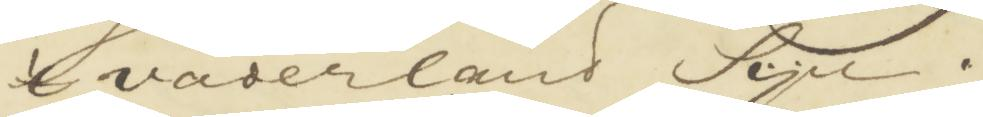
't vaderland Sijn
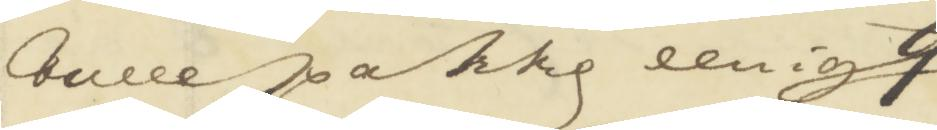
twee pakken eenigs:ts v: buijten beschadigt
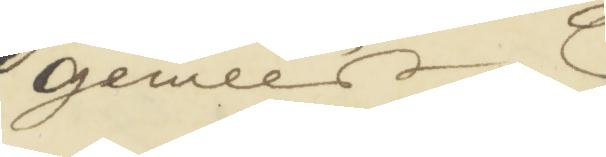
geweest Namentlijk
